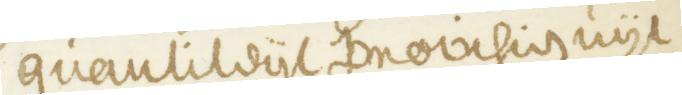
quantiteijt provisien uijt
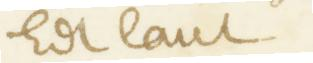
het lant
